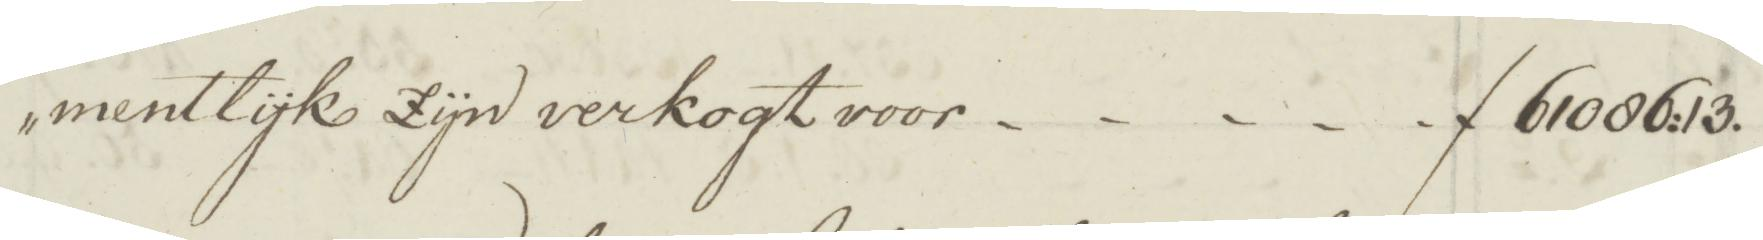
„mentlijk zijn verkogt voor - - - - - ƒ 61086:13.
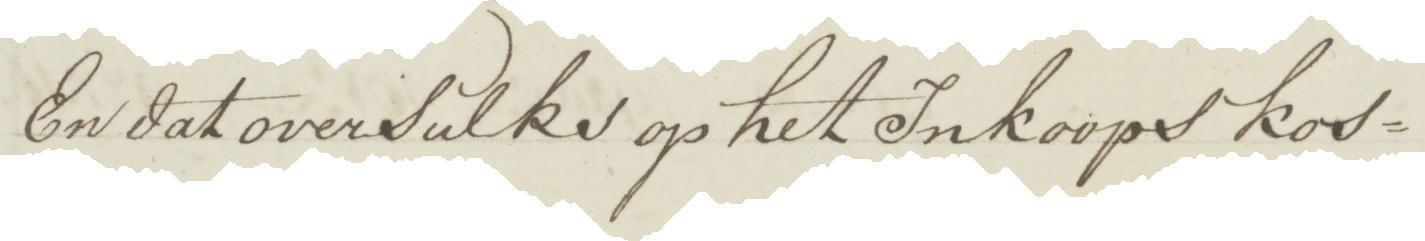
En dat oversulks op het Jnkoops kos=
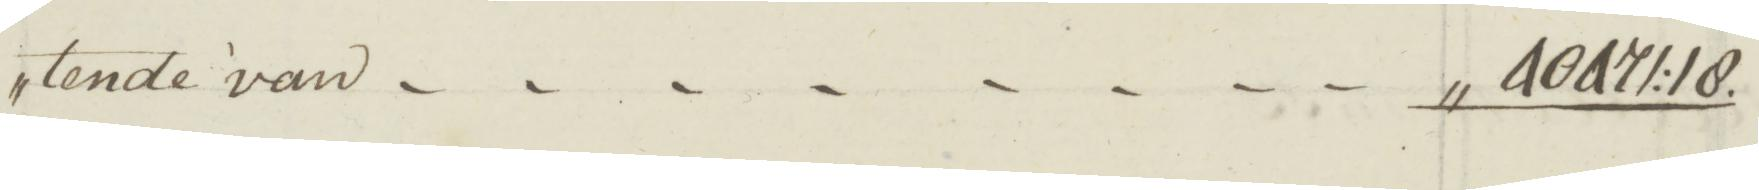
„tende van - - - - - - - - „ 40471:18:
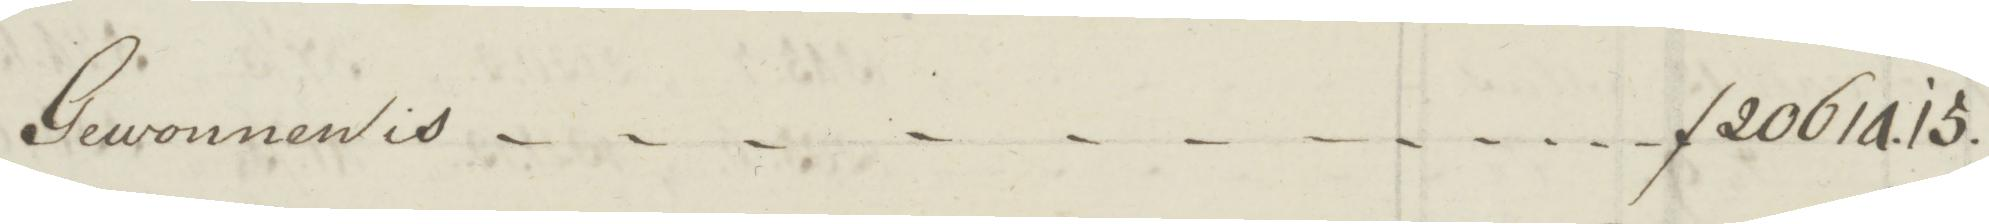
Gewonnen is - - - - - - - - - - - - ƒ20614.15.
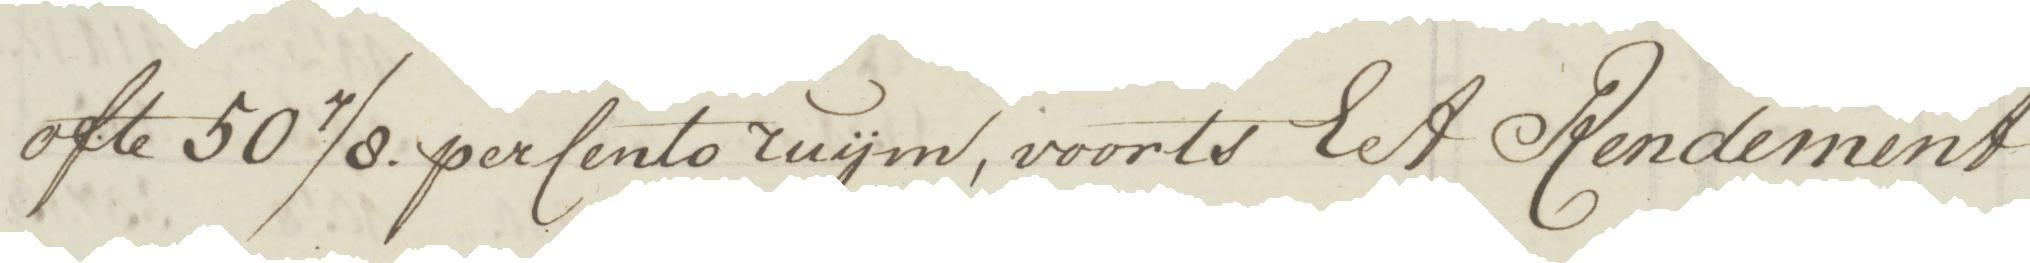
ofte 50 7/8. percento ruijm, voorts het Rendement
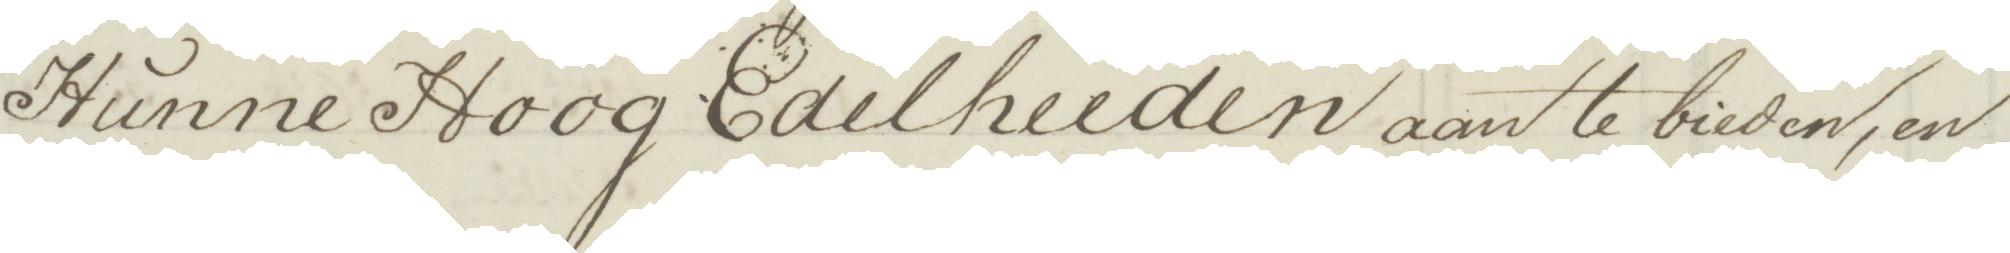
Hunne Hoog Edelheeden aan te bieden, en
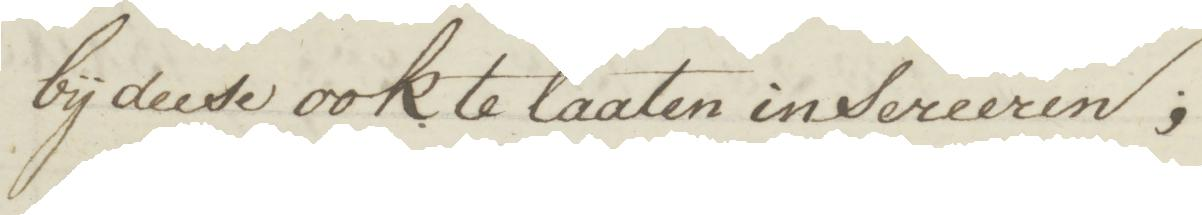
bij deese ook te laaten insereeren;
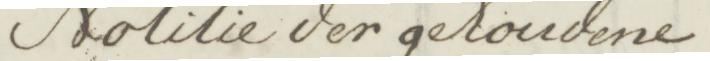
Notitie der gehoudene
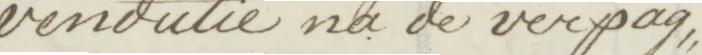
vendutie na de verpag„
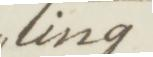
„ting
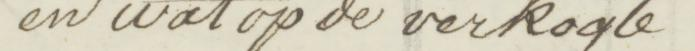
en wat op de verkogte
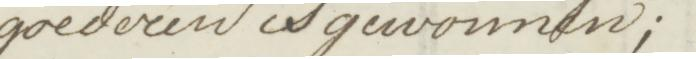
goederen is gewonnen;
